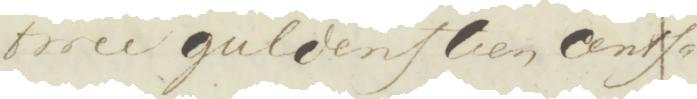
twee guldens tien cents
